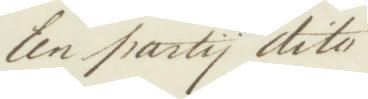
Een partij dito
